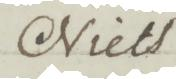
Niets
